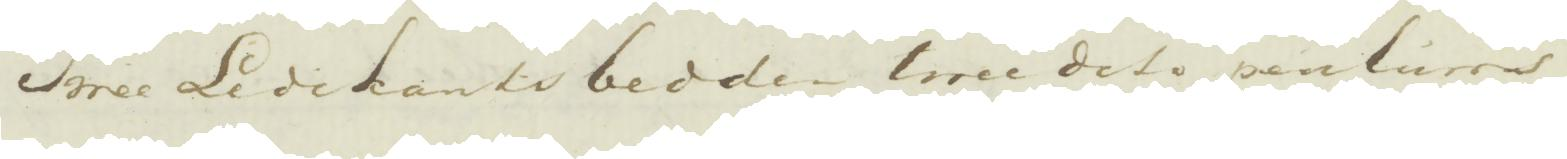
Twee Ledikante bedden, twee dito peuluws,
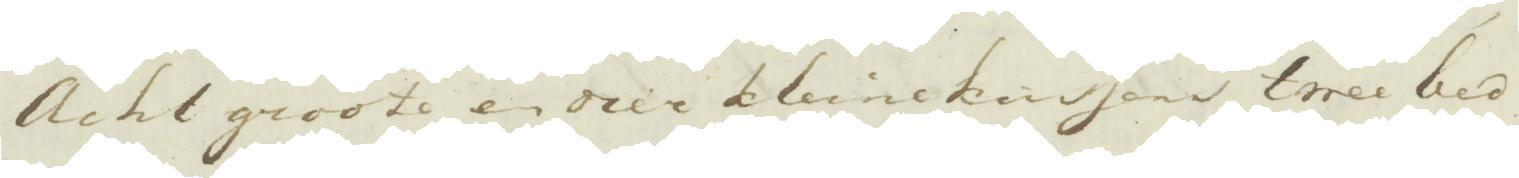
Acht groote en vier kleine kussens, twee bed
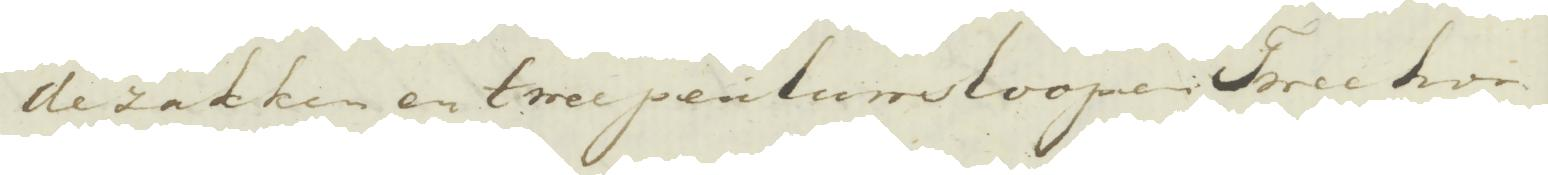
de zakken en twee peuluwsloopen Twee hon„
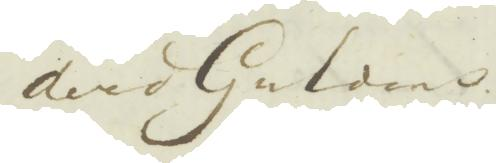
derd Guldens.
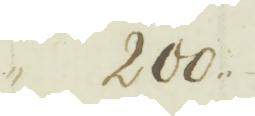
„ 200„
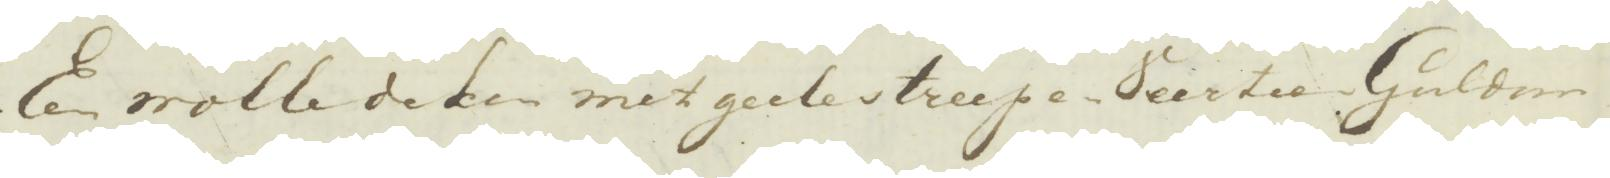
Een wolle deken met geele streepen Veertien Guldens
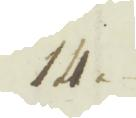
14„
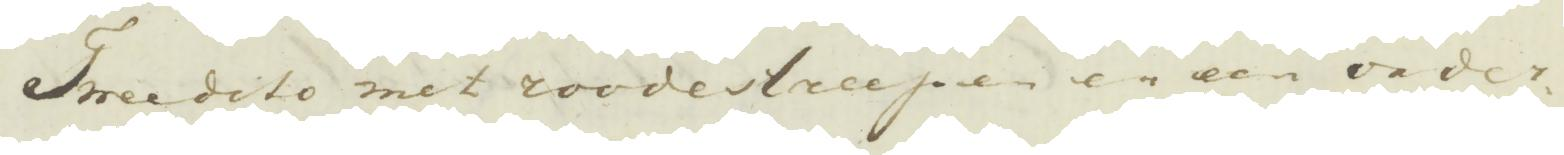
Twee dito met roode streepen en een onder
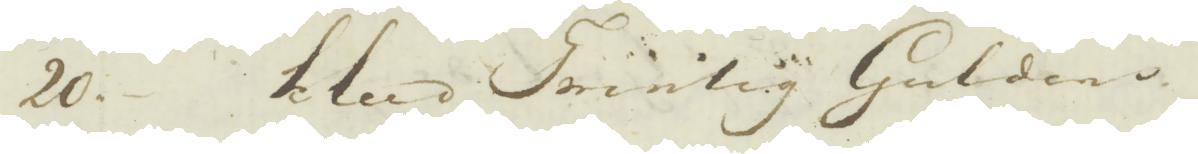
20„ - kleed Twintig Guldens.
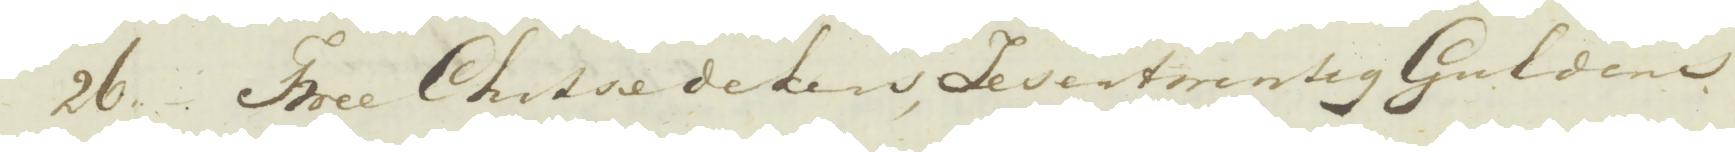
26„ -. Twee Chitse dekens, Zesentwintig Guldens.
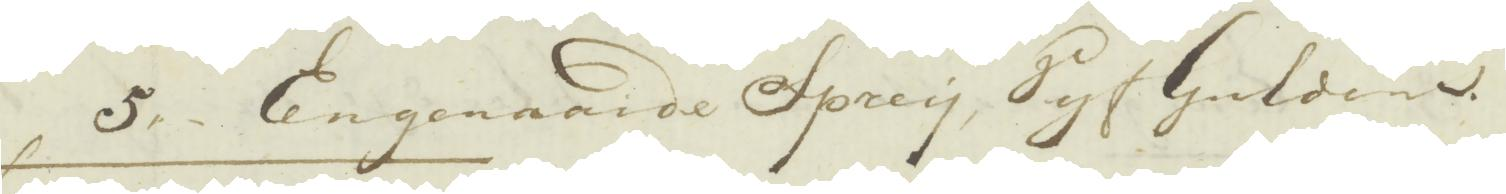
5„- Een genaaide Spreij, Vyf Guldens.
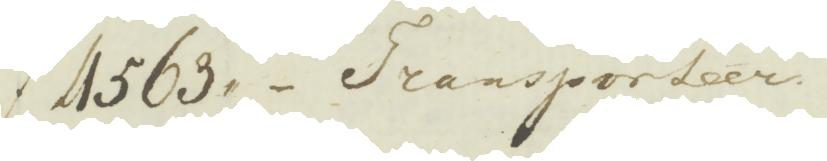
ƒ 4563„ - Transporteer.
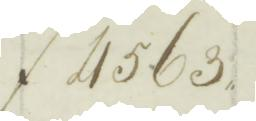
ƒ 4563„
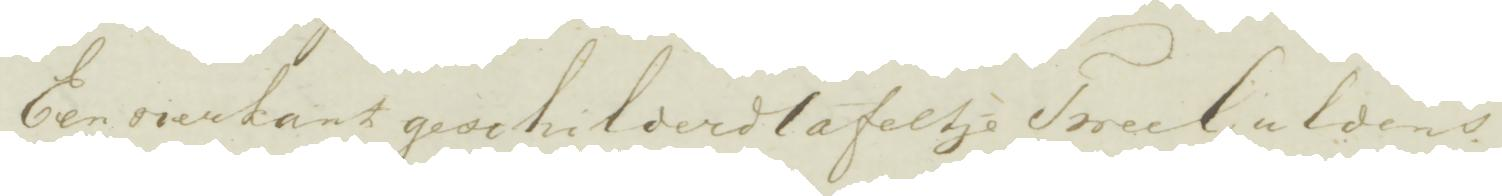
Een overkant geschilderd tafeltje Twee Guldens.
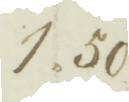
1„50
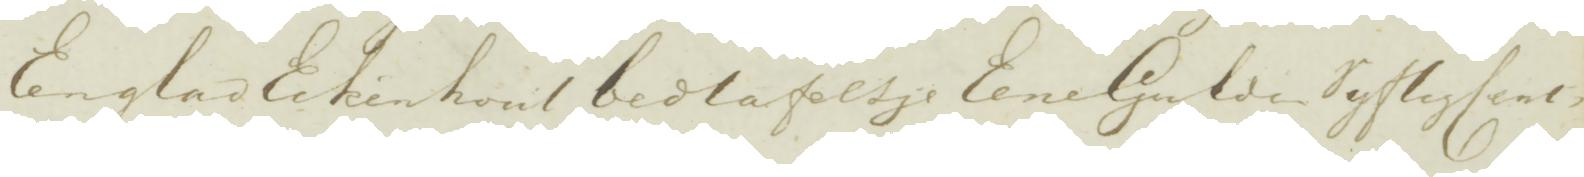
Een glad Eikenhout bedtafeltje Eene Gulden Vyftig Cents
